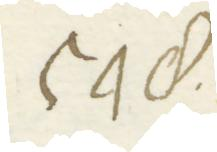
548.
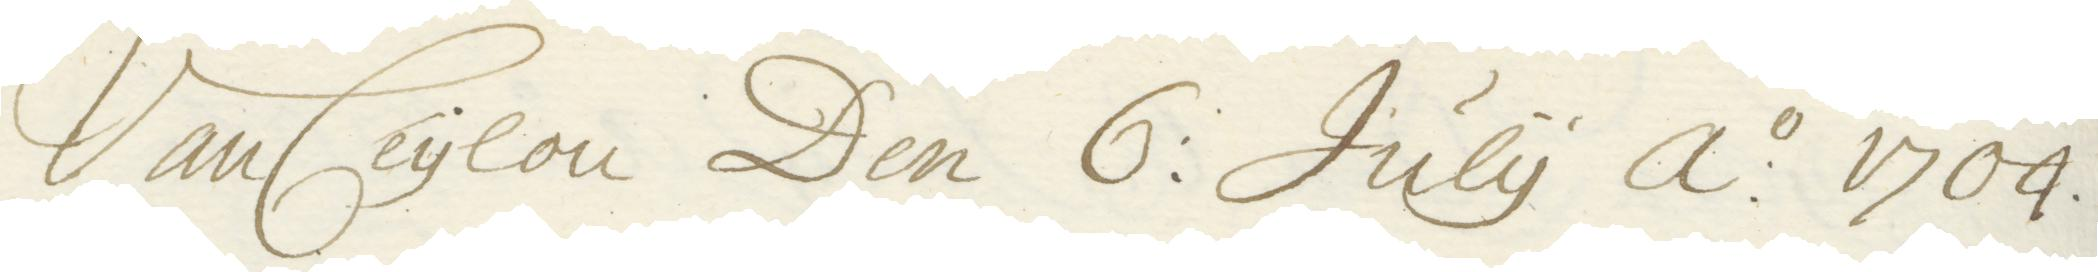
Van Ceijlon Den 6: Julij a:o 1704.
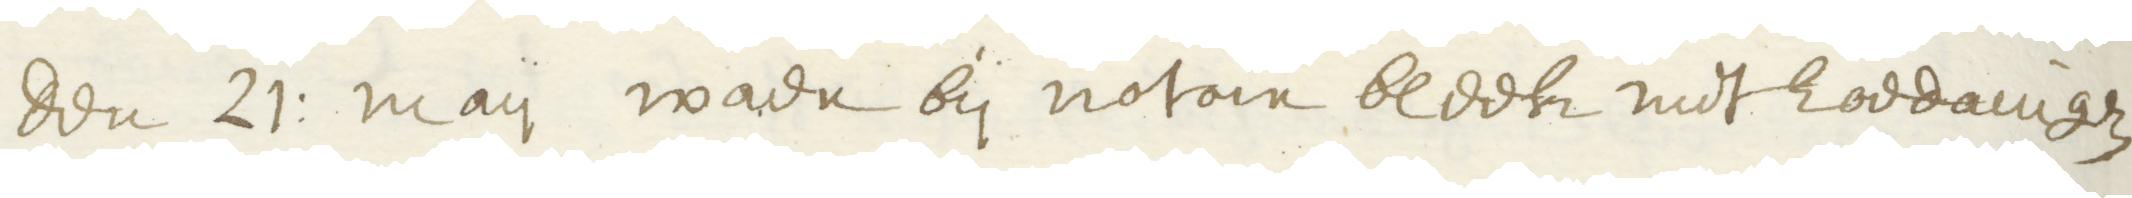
den 21: maij waer bij notoir bleek met hoedanigen
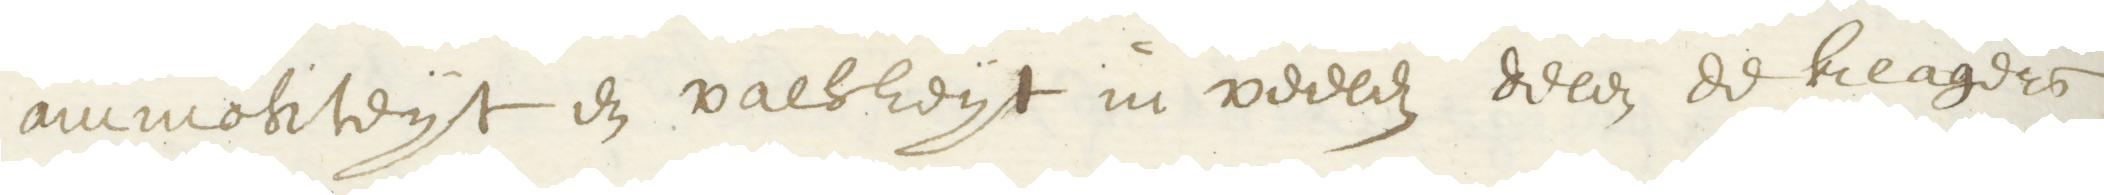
animositeijt en valsheijt in veelen delen de klagers
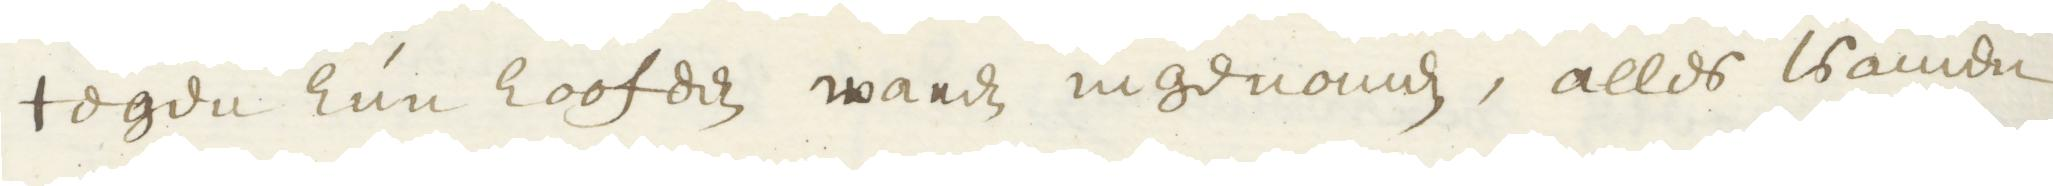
tegen hun hoofden waren ingenomen, alles tsamen
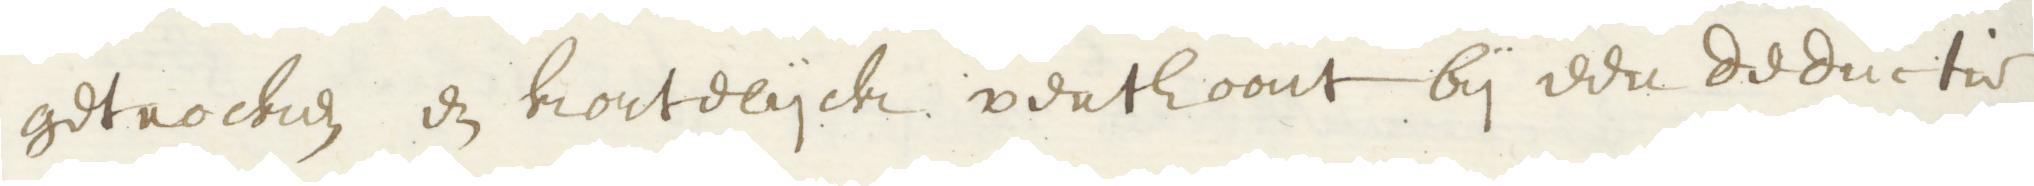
getrocken en kortelijck verthoont bij een deductie
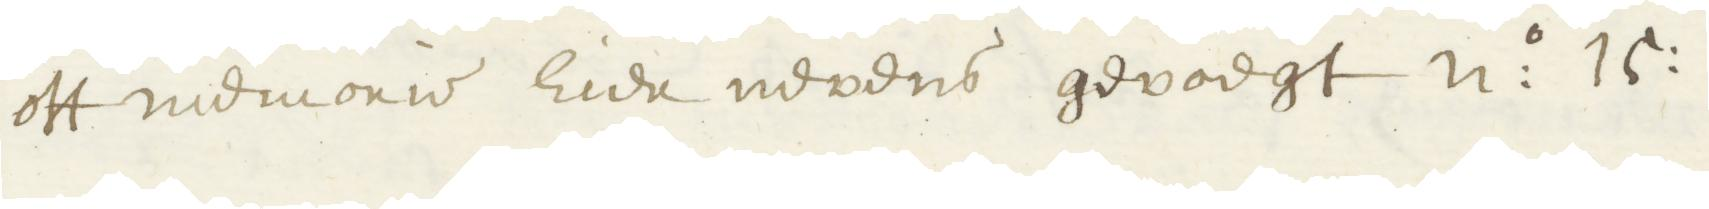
off memorie hier nevens gevoegt n:o 15:
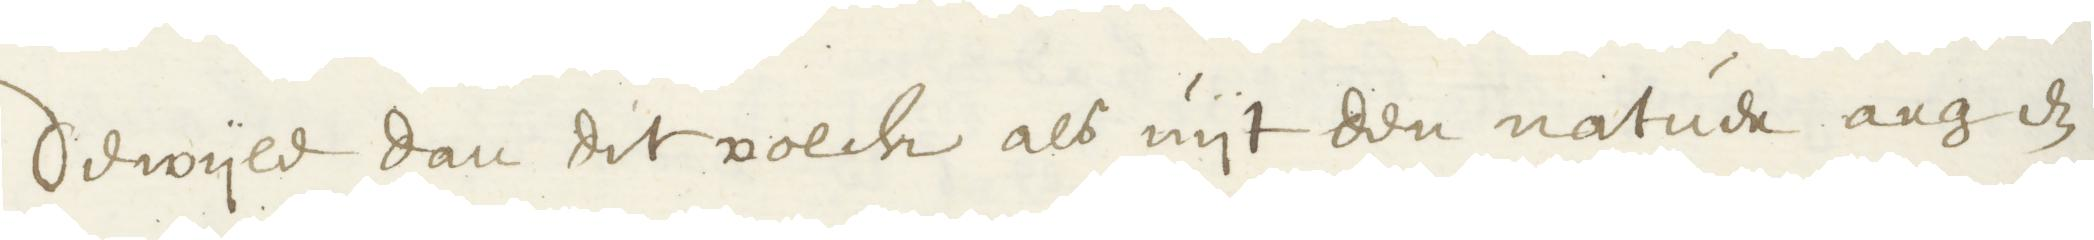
dewijle dan dit volck als uijt den natuer arg en
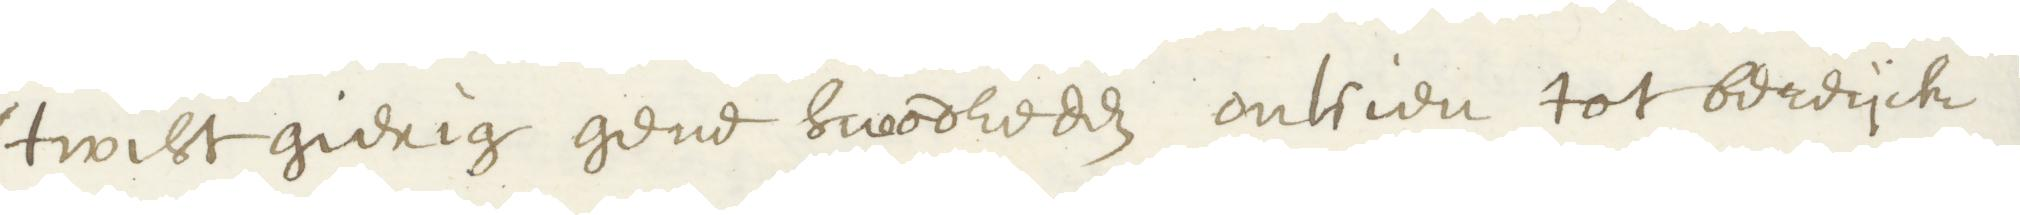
twist gierig gene swodheden ontsien totbereijck
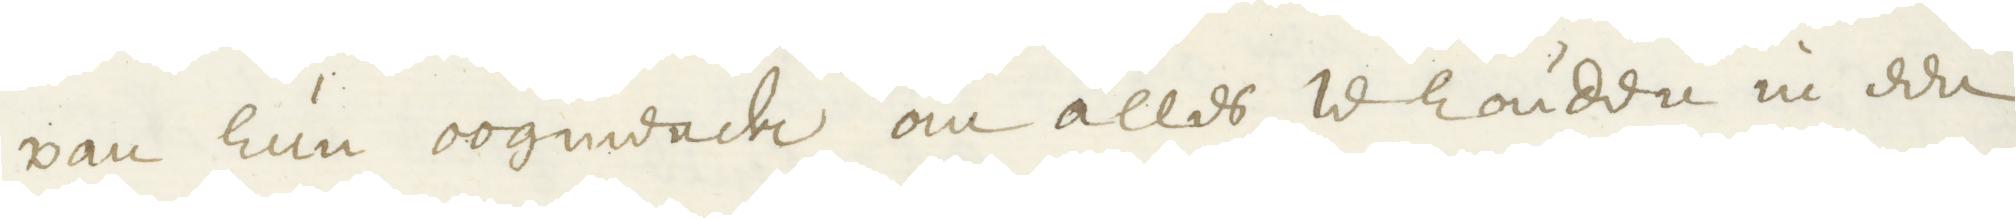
van hun oogmerck om alles te houden in een
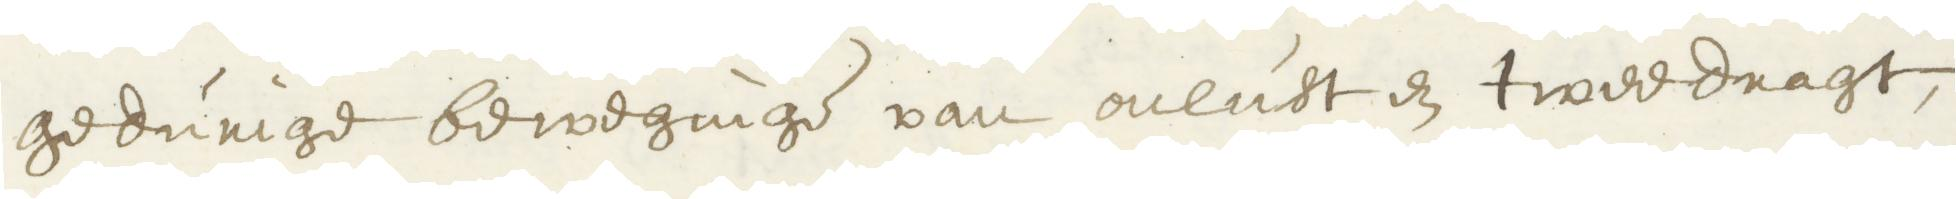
gedurige beweginge van onlust en tweedragt,
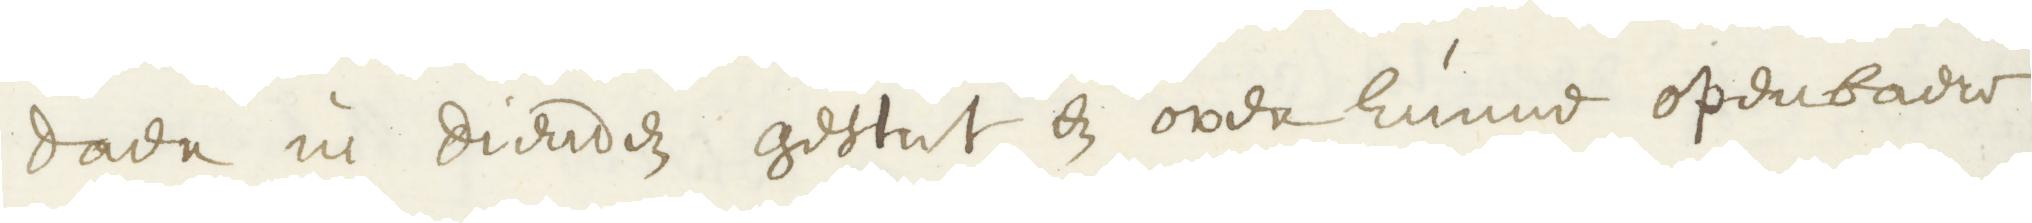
daer in dienden gestut en over hunne openbaere
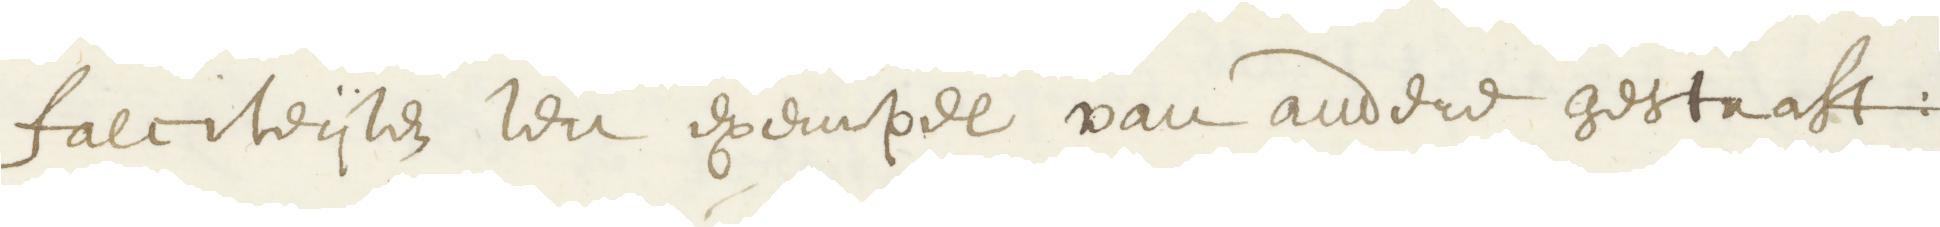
falciteijten ten exempel van andere gestraft:
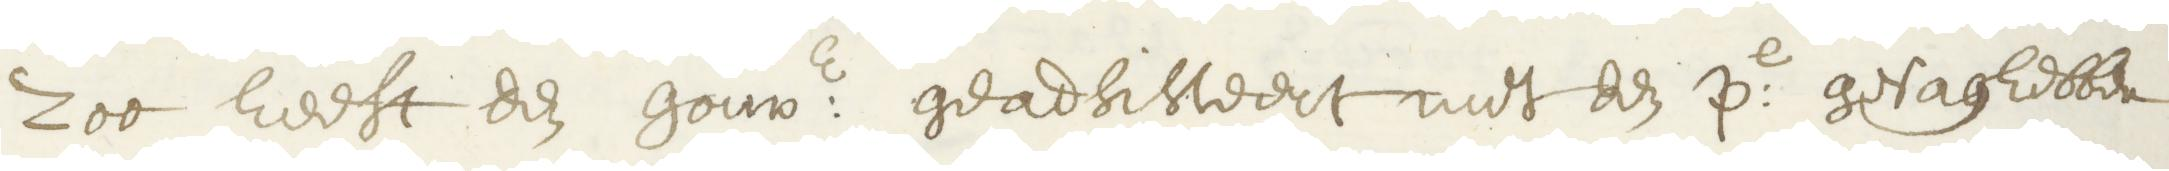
zoo heeft den gouv:r geadsisteert metden p:l gesaghebber
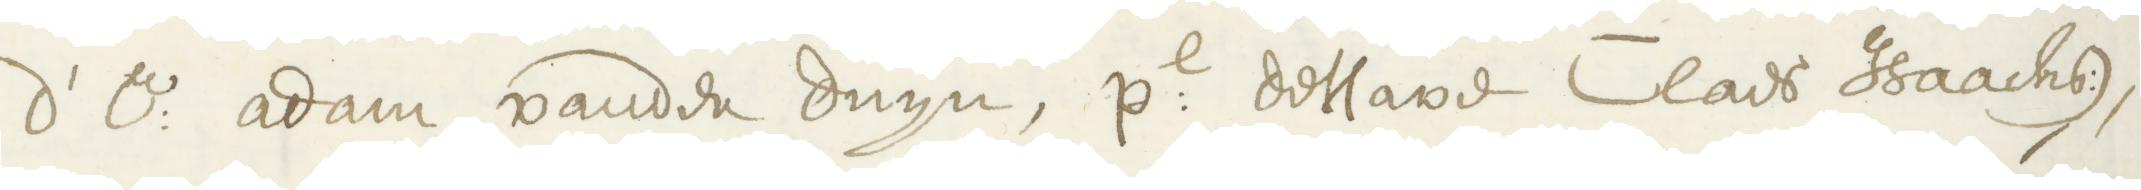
d’ E: adam vander duijn, p:l dessave Claes Isaacks:,
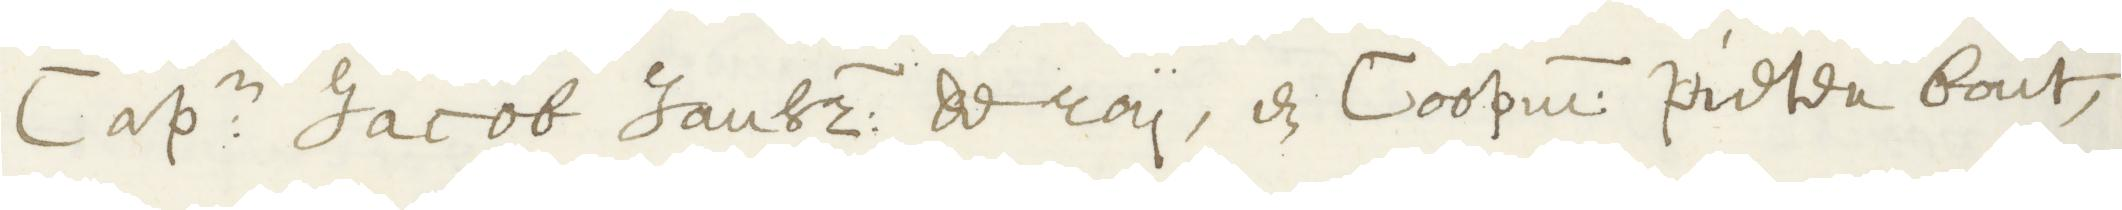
Cap:n Jacob Jansz: de roij, en Coopm: pieter bout,
